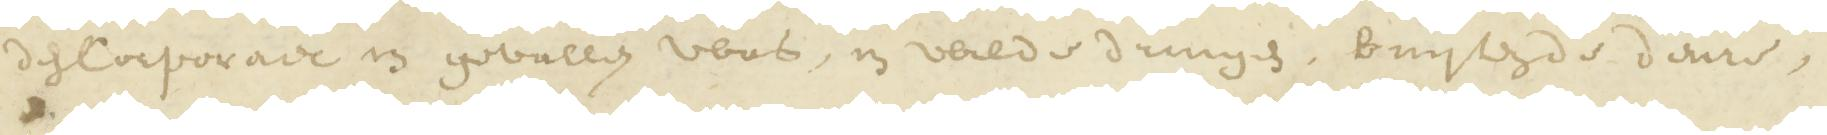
den Corporael in gevallen was, in wilde dringen, buyten de deur,
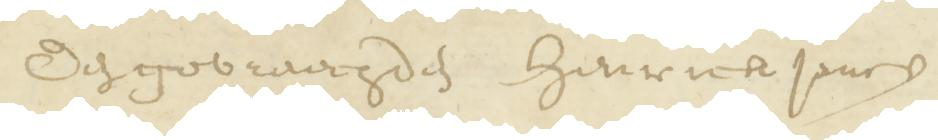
Den gevraachden Henrick past
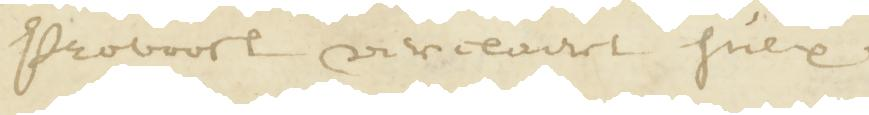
provoost verclaert sulx
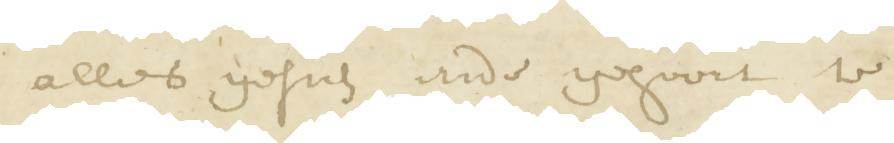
alles gesien ende gehoort te
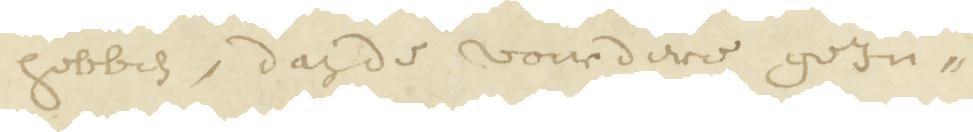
hebben, dan de voordere gein„
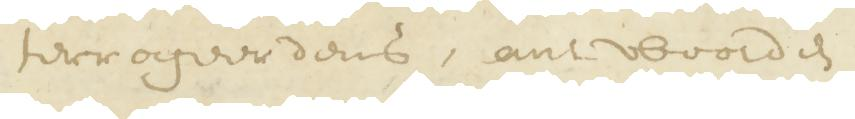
terrogeerdens, antwoorden
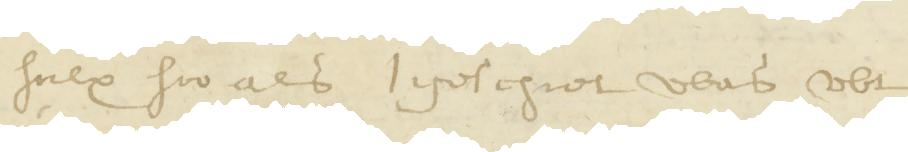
sulx soo als tgeschiet was wt
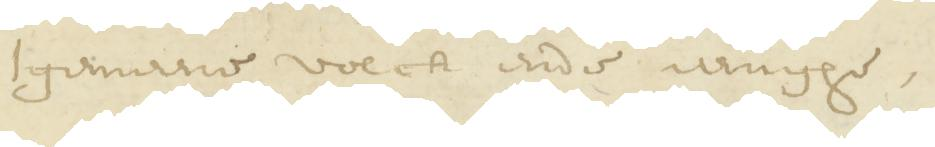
tgemeene volck ende eenighe,
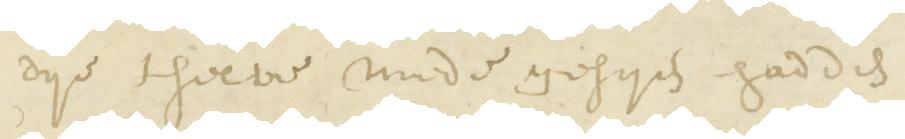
dys tselve mede gesyen hadden
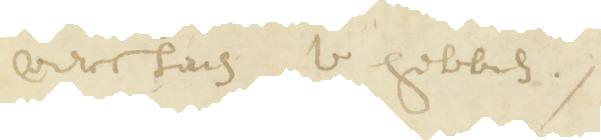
verslach te hebben./
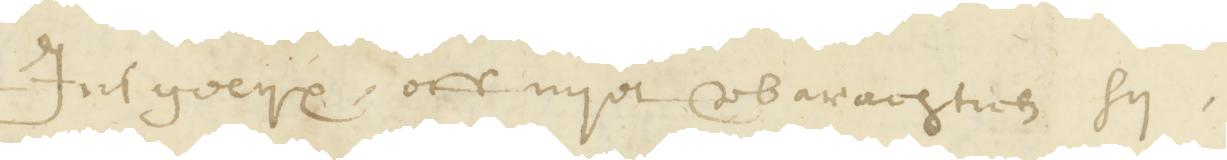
Insgelyx, off nyet warachtich sy,
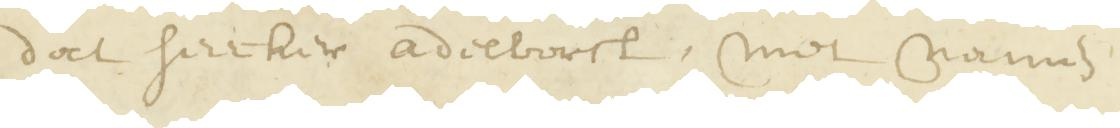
dat seecker adelborst, met namen
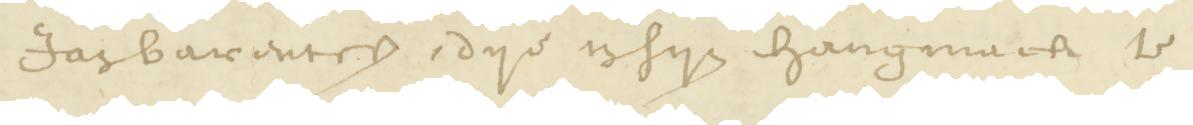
Jan barentst, dye in syn hangmack te
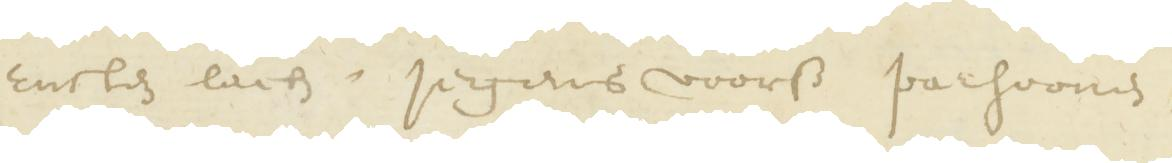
rusten lach jegens voorsz parsoonen
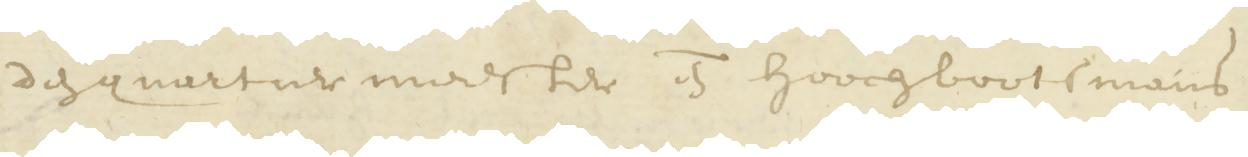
den quartier meester en hoochbootsmans
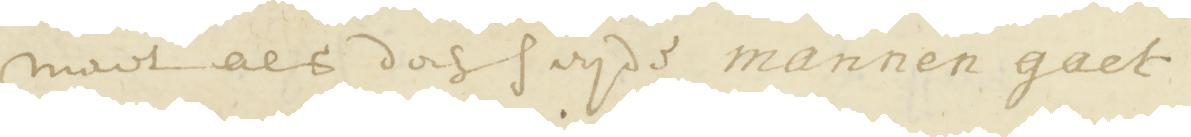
moet als doch seyde mannen gaet
